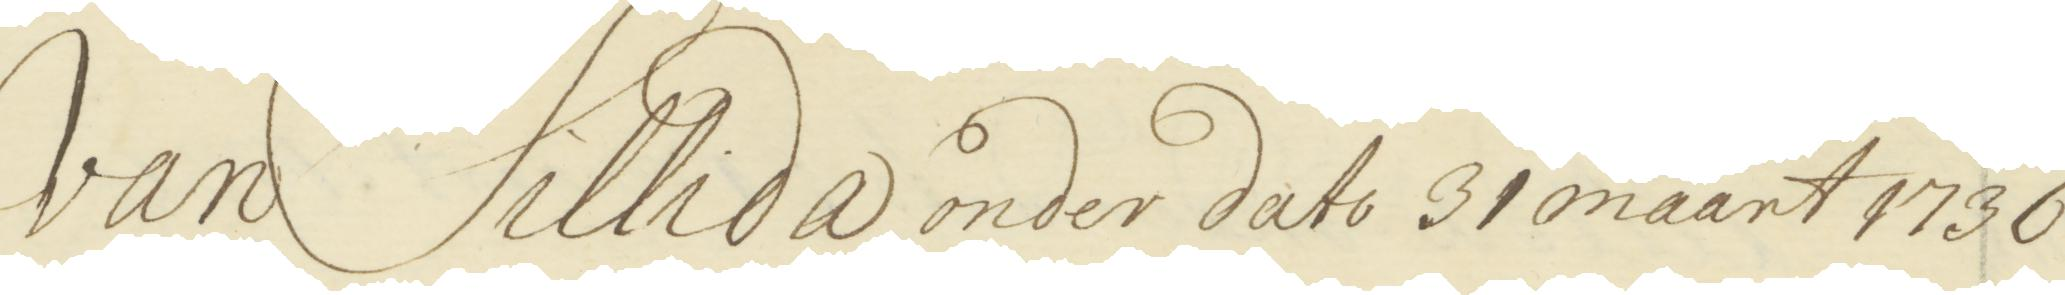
Van Sillida onder dato 31 maart 1736
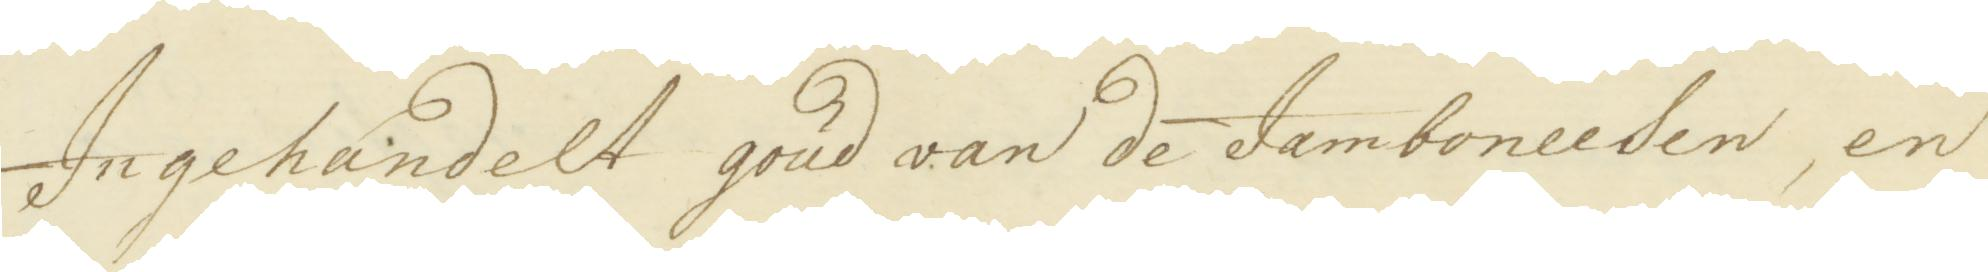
Ingehandelt goud van de Jamboneesen, en
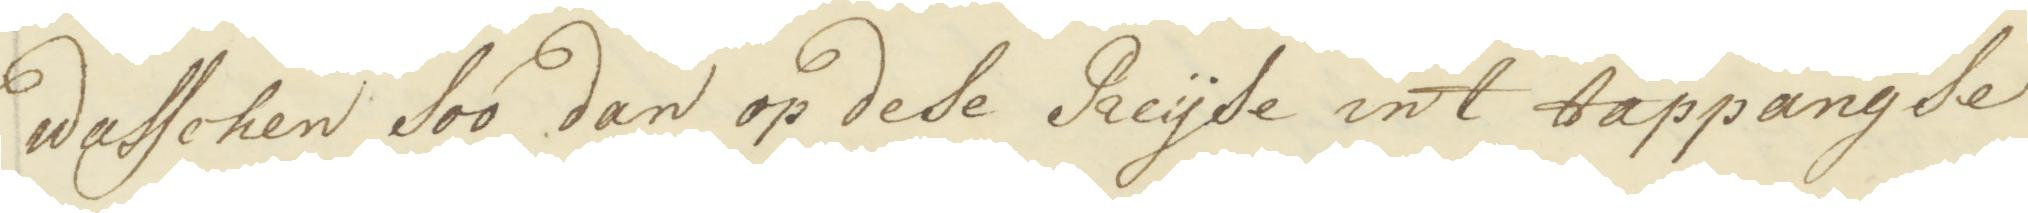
wasschen soo dan op dese Reijse in ’t tappangse
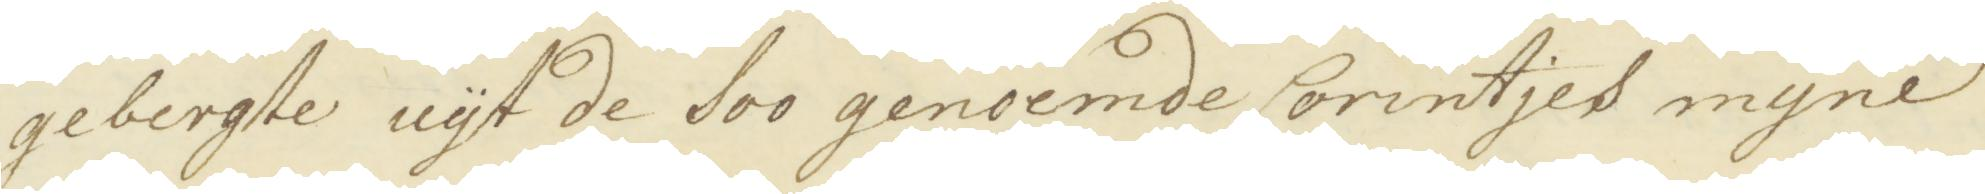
gebergte uijt de soo genoemde Corintjes myne
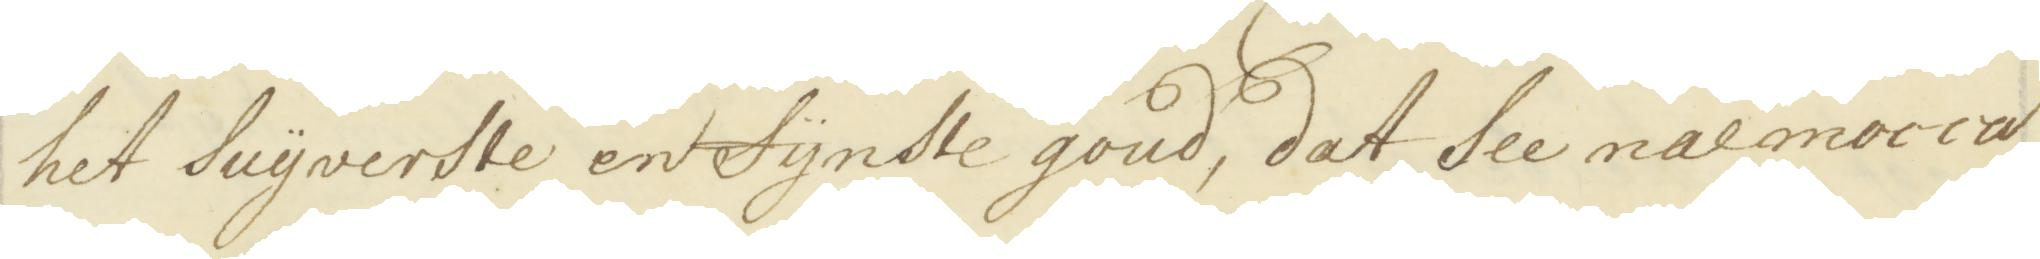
het suijverste en fijnste goud, dat see nae mocca
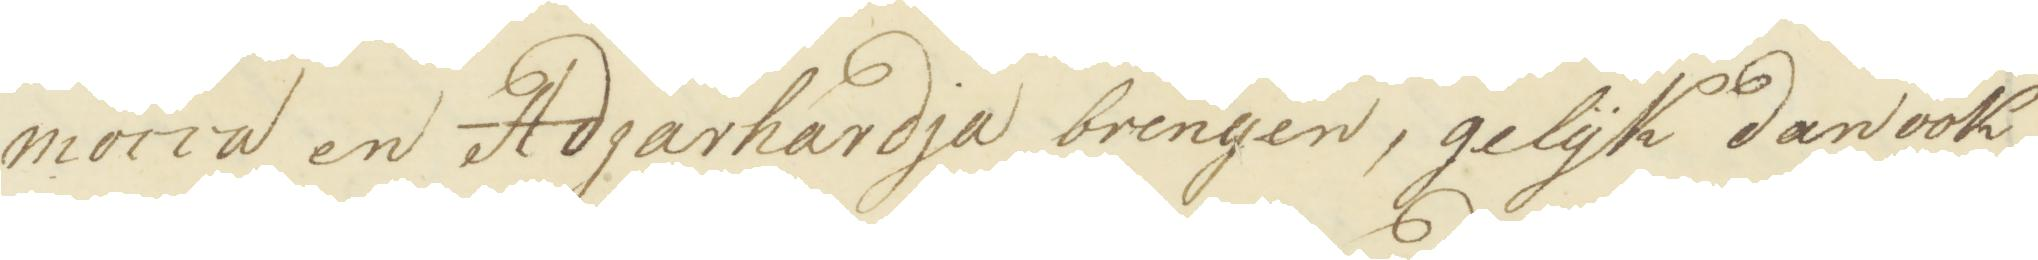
mocca en Adgarhardja brengen, gelijk dan ook
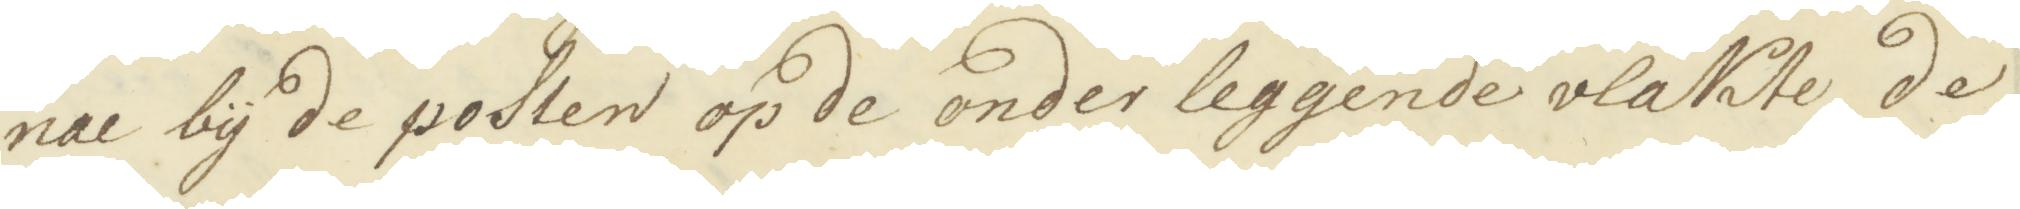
nae bij de posten op de onder leggende vlakte de
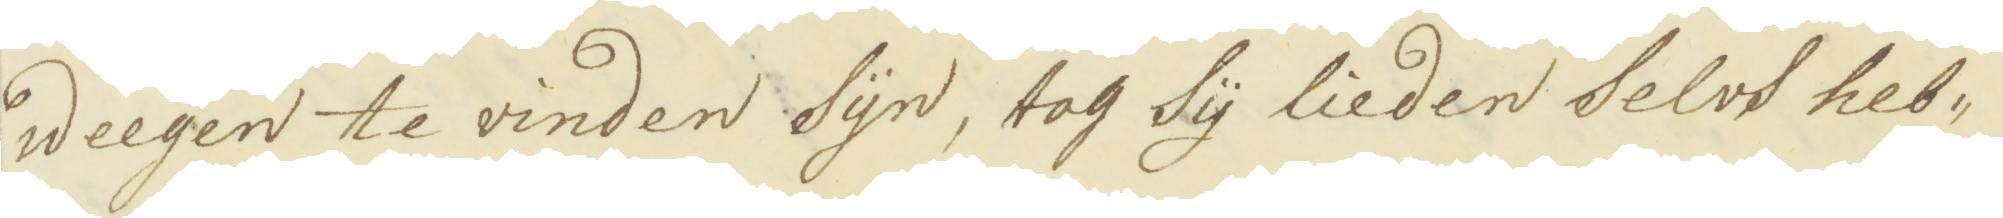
weegen te vinden sijn, tog sij lieden selvs heb„
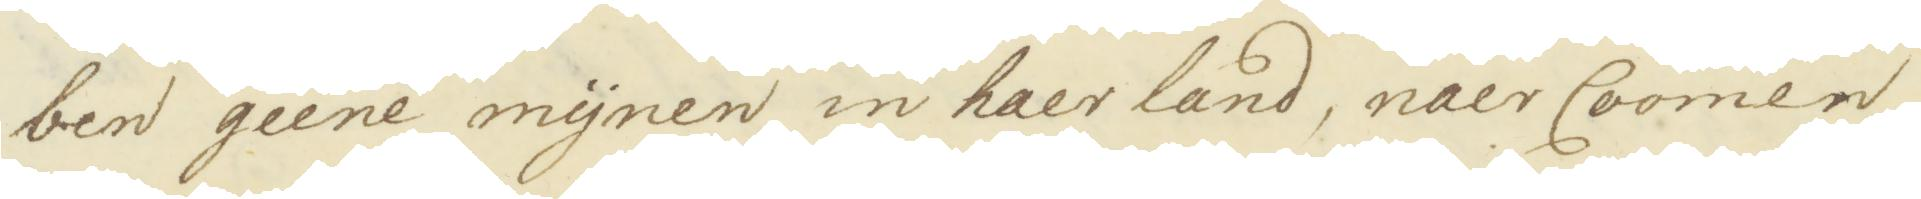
ben geene mijnen in haer land, naer Coomen
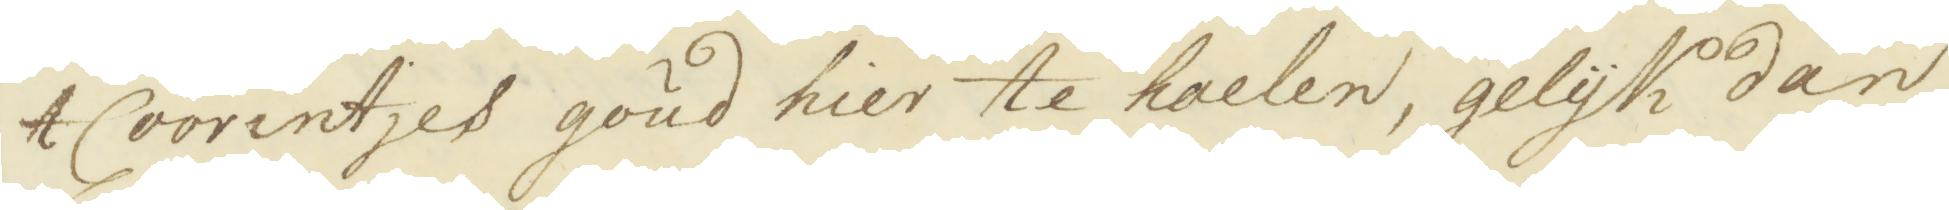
t Coorintjes goud hier te haelen, gelijk dan
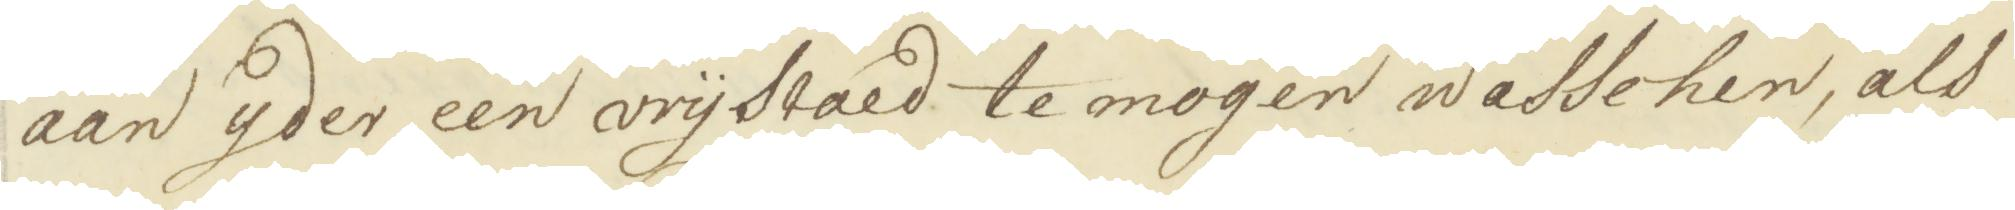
aan yder een vrijstaed te mogen wasschen, als
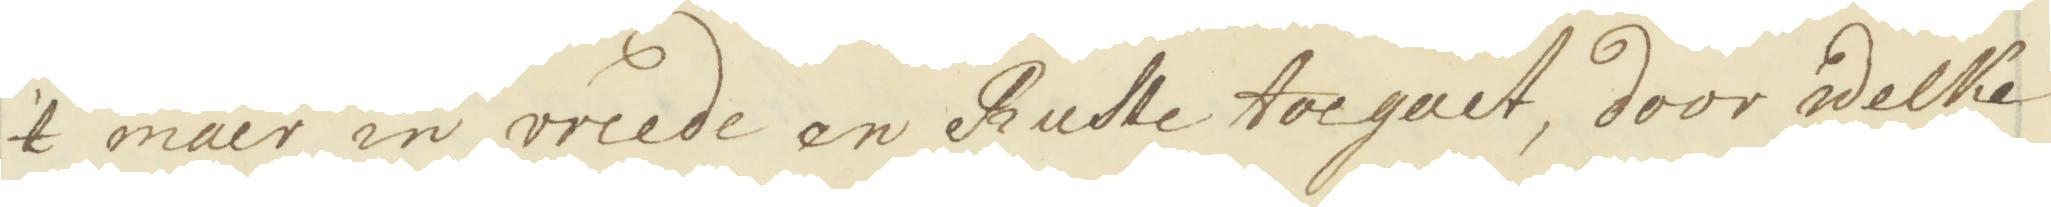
’t maer in vreede en Ruste toegaet, door welke
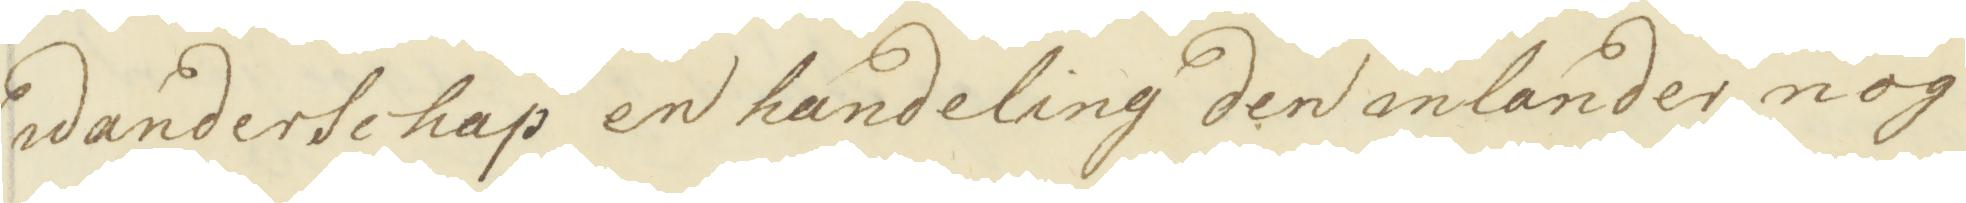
wanderschap en handeling den inlander nog
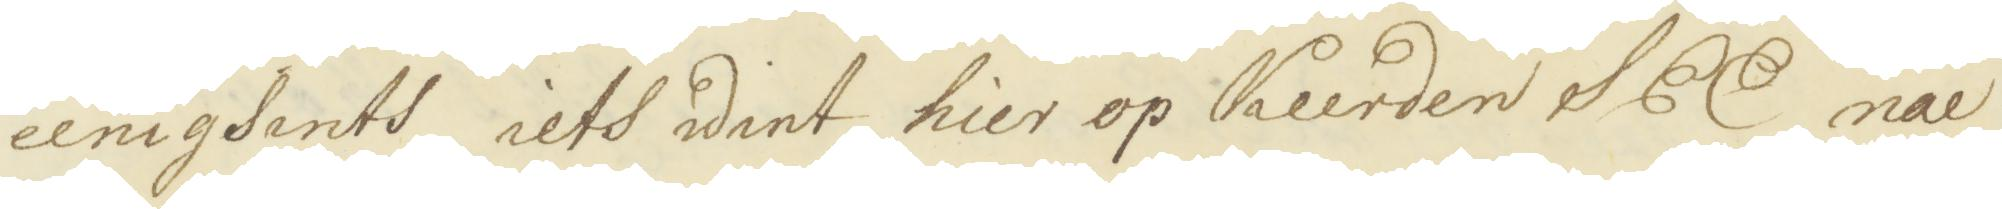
eenigsints iets wint, hier op keerden SEE nae
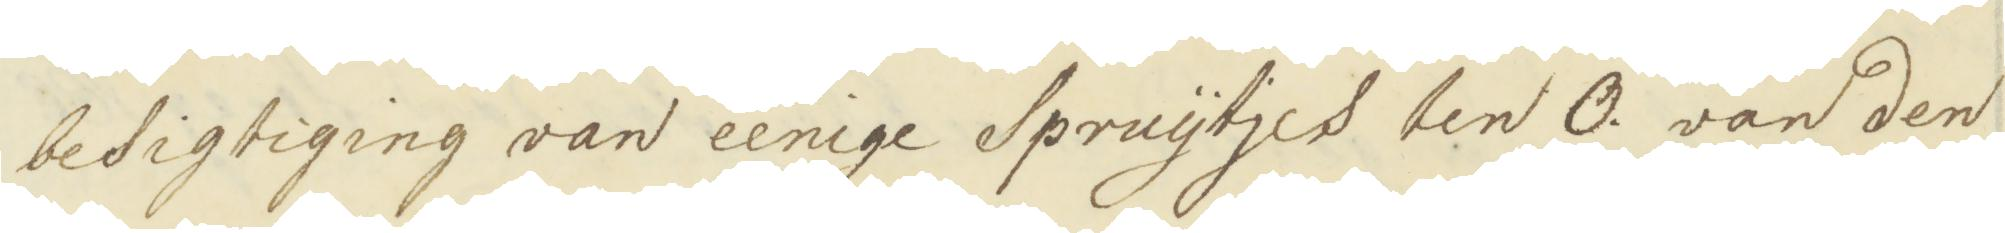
besigtiging van eenige spruijtjes ten O. van den
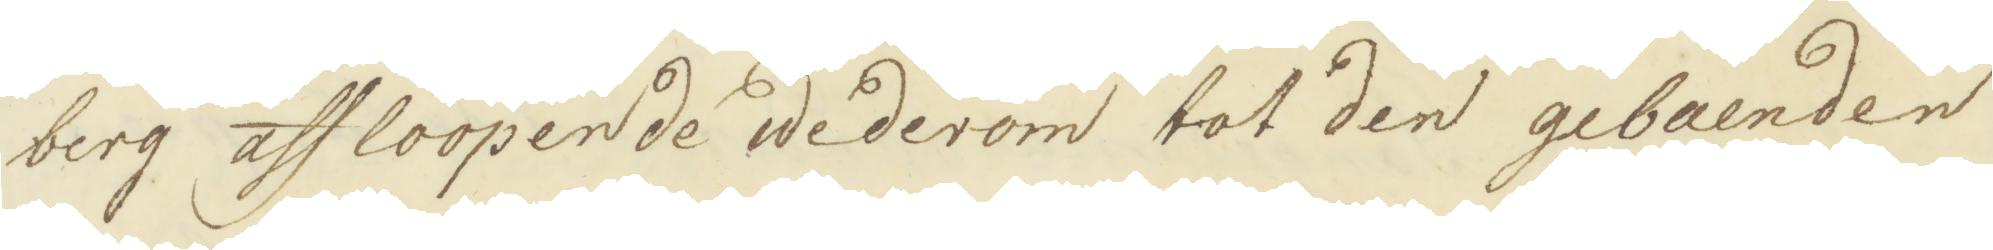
berg affloopen de wederom tot den gebaenden
